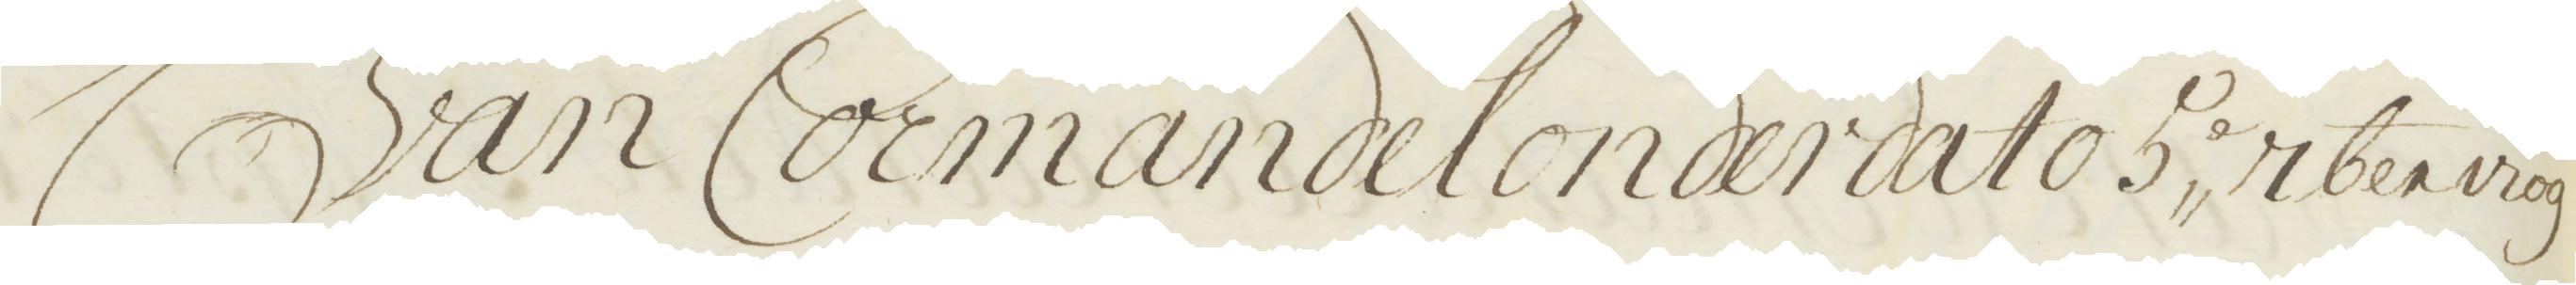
Van Cormandelonderdato 5„e 7ber 1709
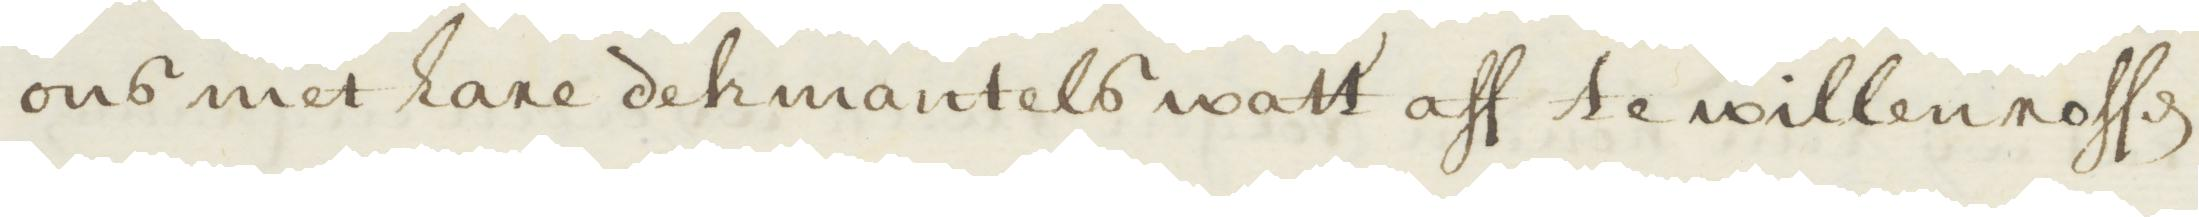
ons met hare dekmantels watt aff te willen rossen
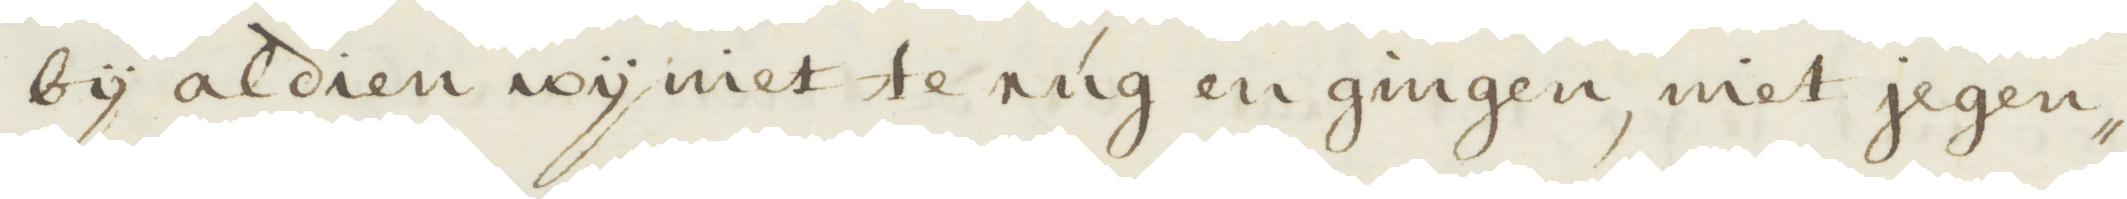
bij aldien wij niet te rug en gingen, niet jegen„
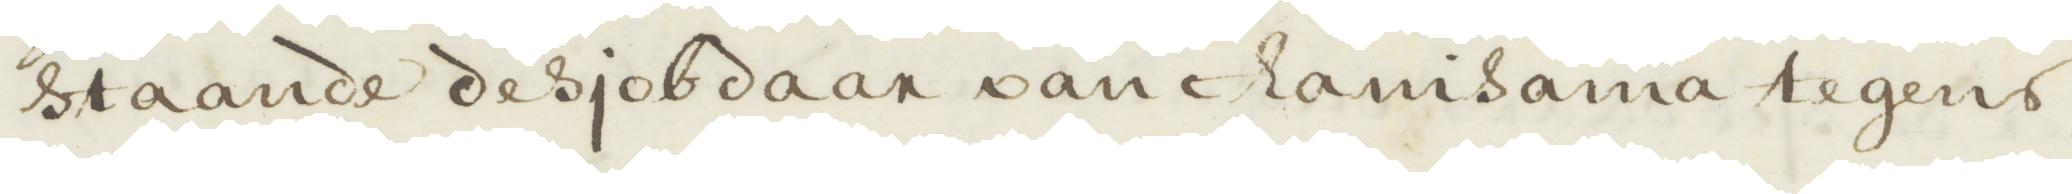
„staande desjobdaar van chanisama tegens
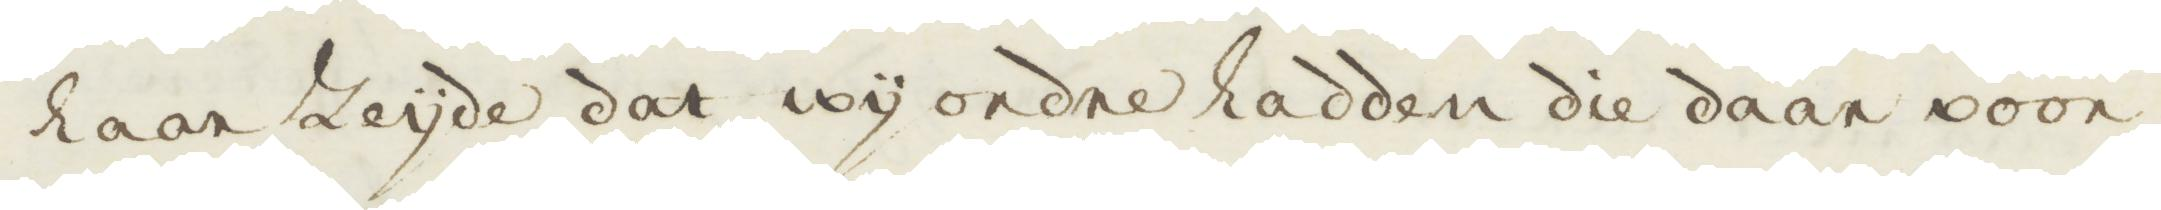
haar zeijde, dat wij ordre hadden die daar voor
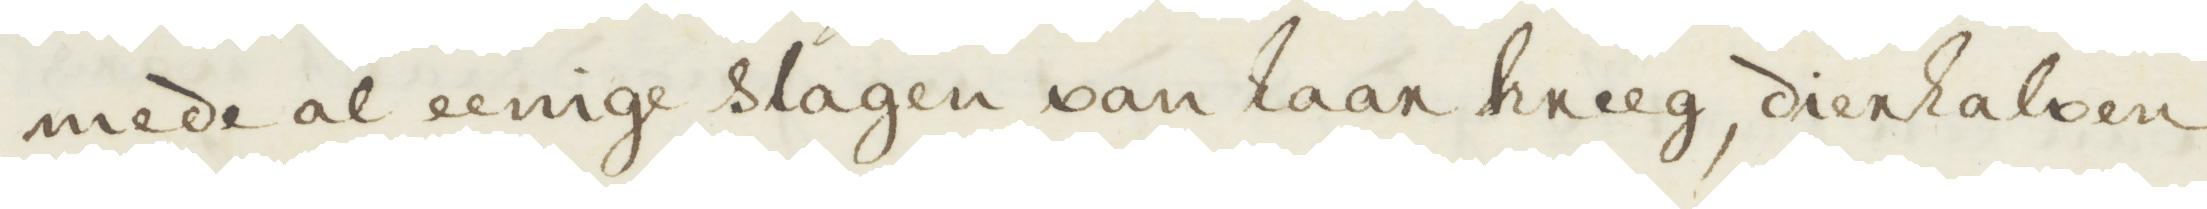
mede al eenige slagen van haar kreeg, dierhalven
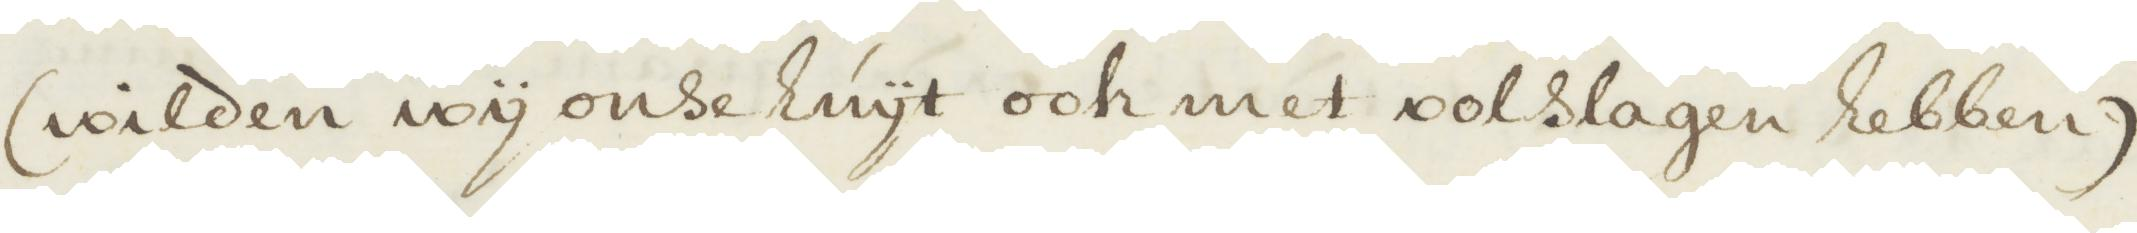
(wilden wij onse huijt ook met volslagen hebben)
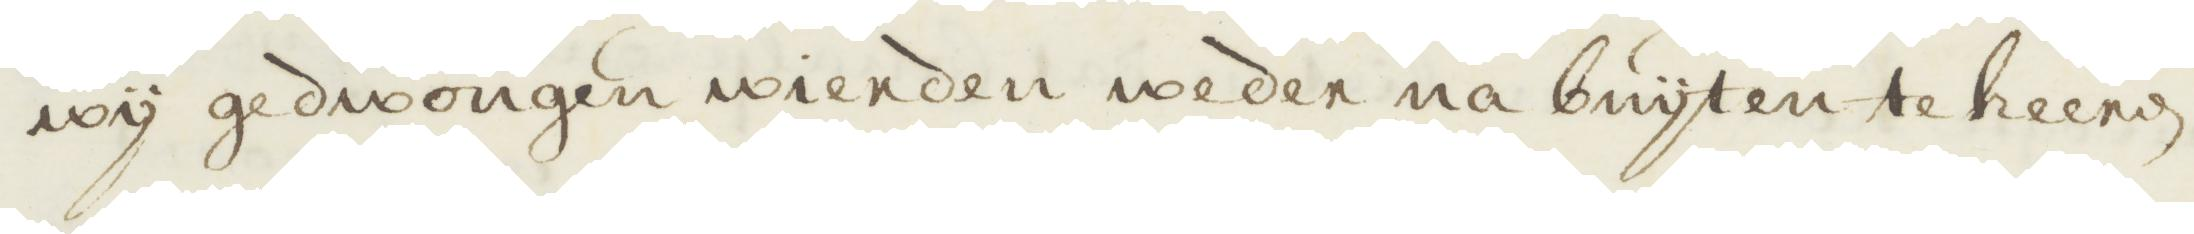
wij gedwongen wierden weder na buijten te keeren
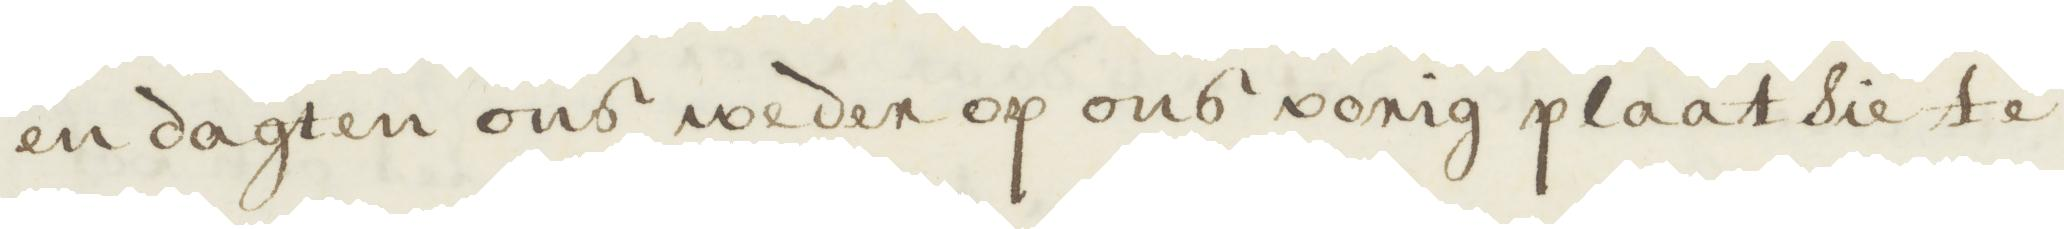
en dagten ons weder op ons vorig plaatsie te
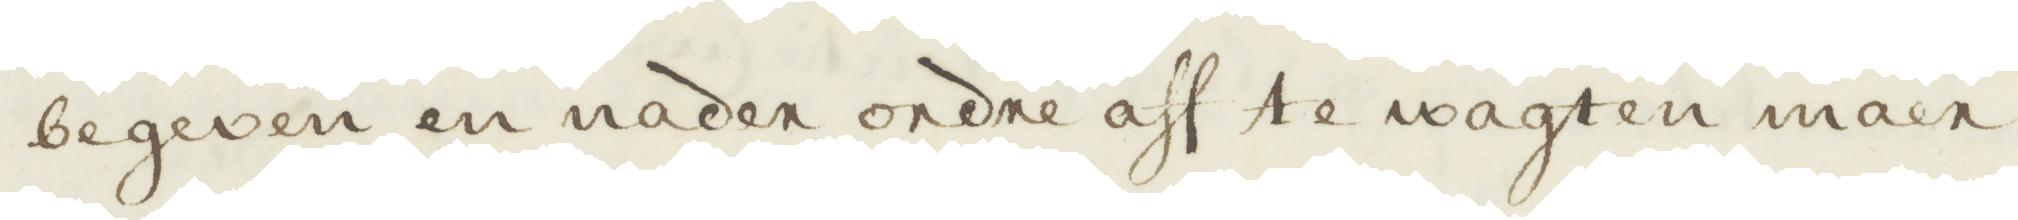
begeven en nader ordre aff te wagten maer
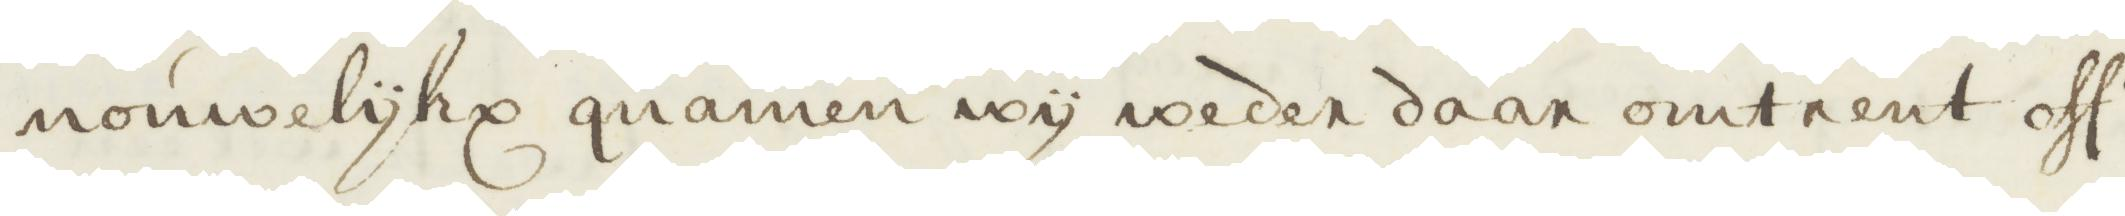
nouwelijkx quamen wij weder daar omtrent offe
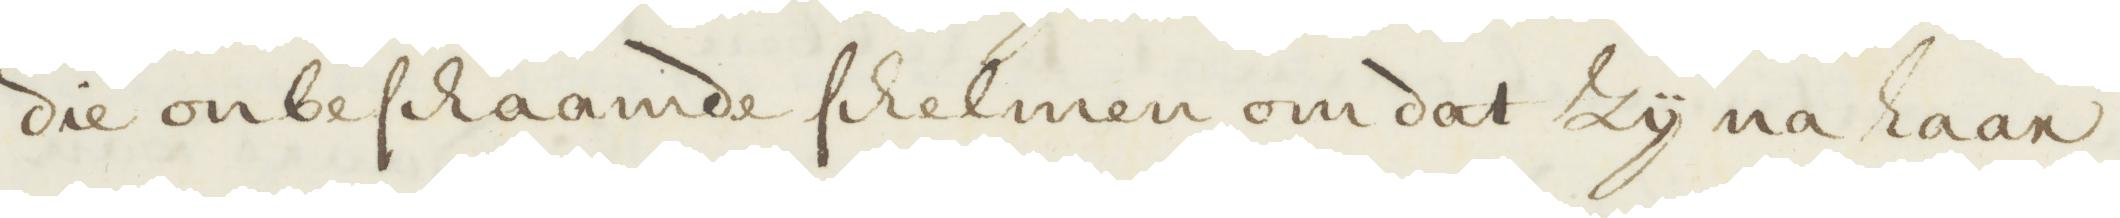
die onbeschaamde schelmen om dat zij na haar
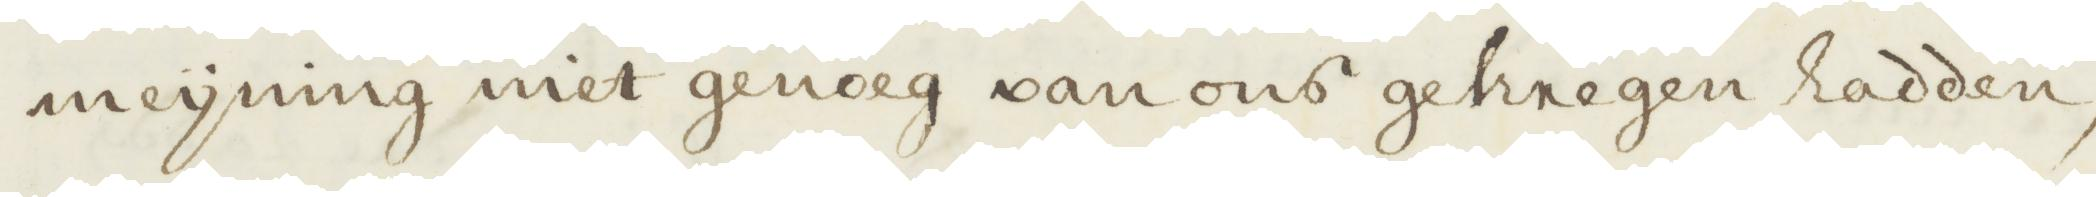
meijning niet genoeg van ons gekregen hadden,
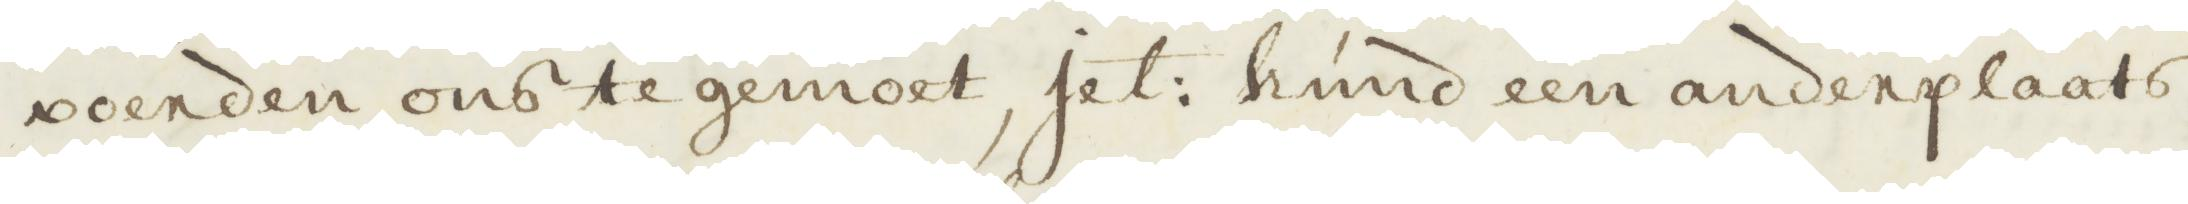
voerden ons te gemoet, jel: kund een anderplaats
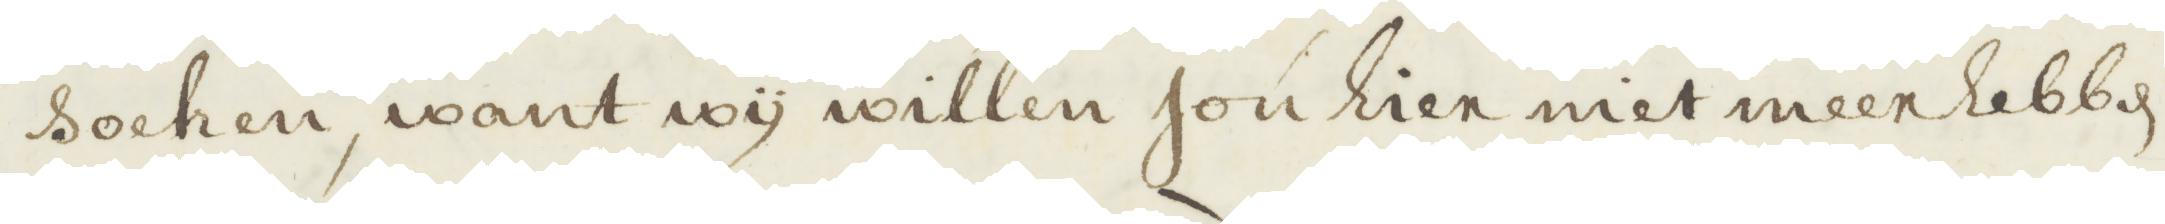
soeken, want wij willen jou hier niet meer hebben
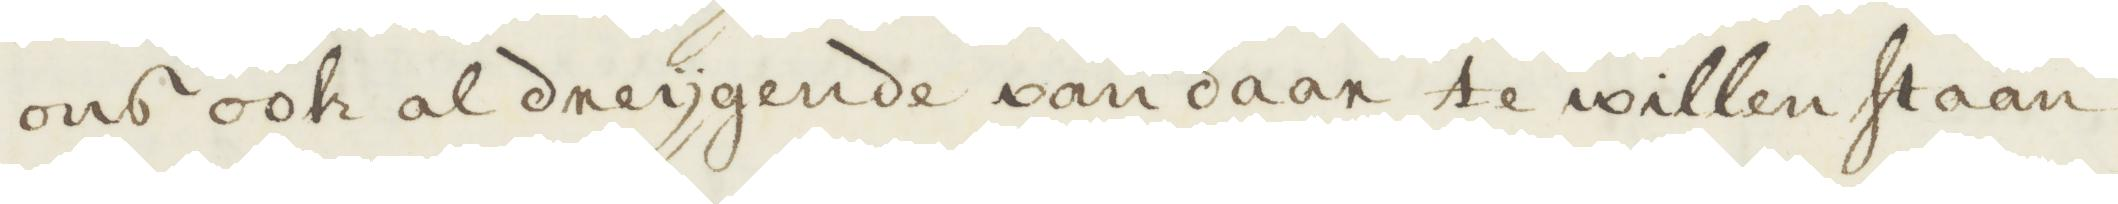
ons ook al dreijgende van daar te willen staan
